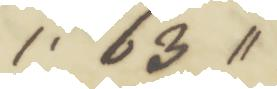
63 „
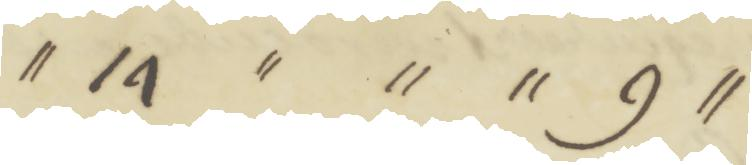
„ 14 „ „ „ 9 „
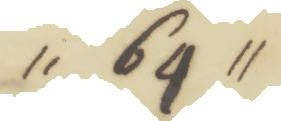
„ 64 „
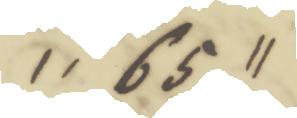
„ 65 „
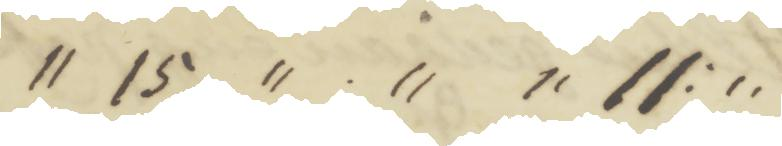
„ 15 „ „ „ 11: „
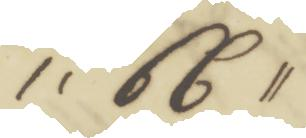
„ 66„
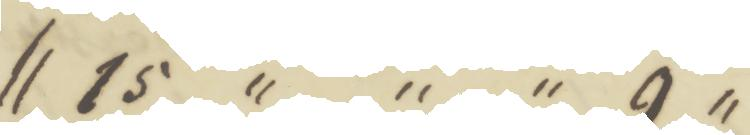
15 „ „ „ 9 „
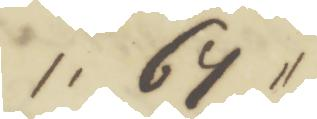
„ 67 „
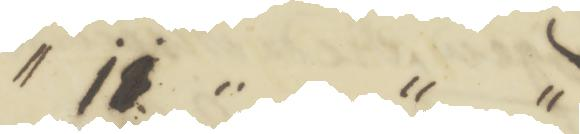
„ 15: „ „ „
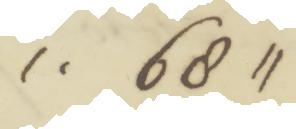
68„
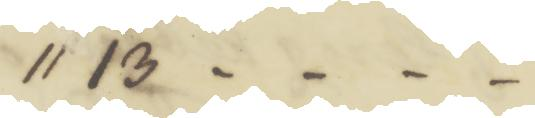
„ 13 - - - –
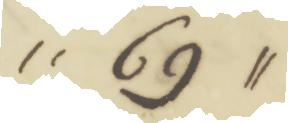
„ 69 „
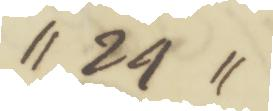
1 24 „
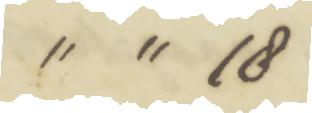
„ „ 18
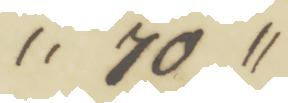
„ 70 „
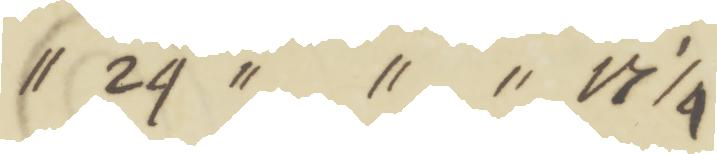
„ 24 „ „ „ 17¼
